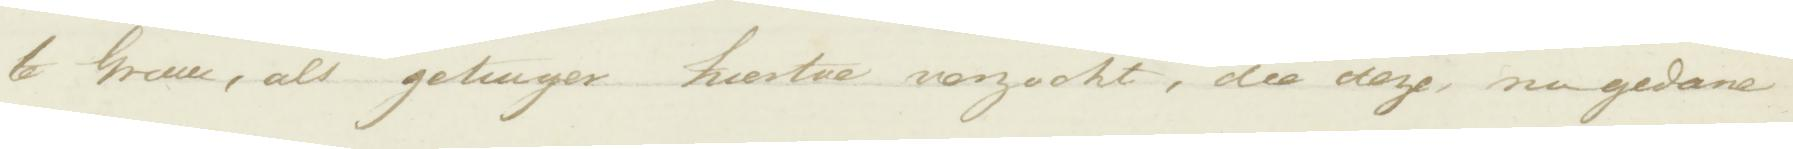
te Grave, als getuiger hiertoe verzocht, die deze, na gedane
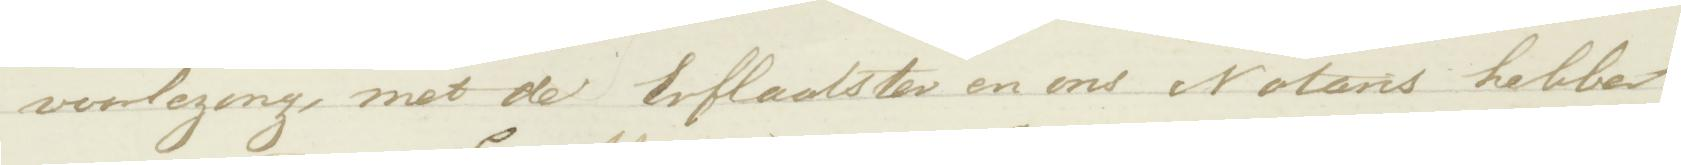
voorlezing, met de Erflaatster en ons Notaris hebbe
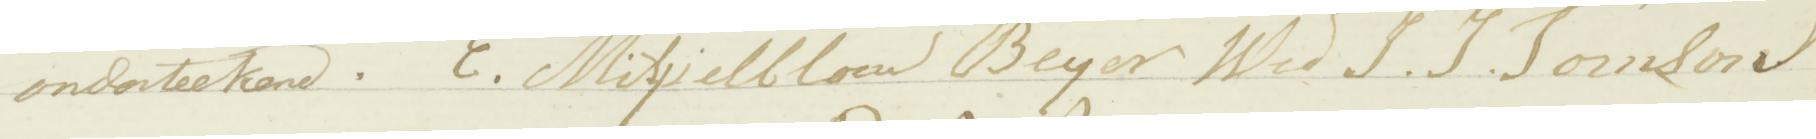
onderteekend. E. Mispelblom Beyer Wed J. J. Tomson
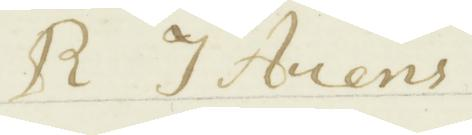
R J Arens
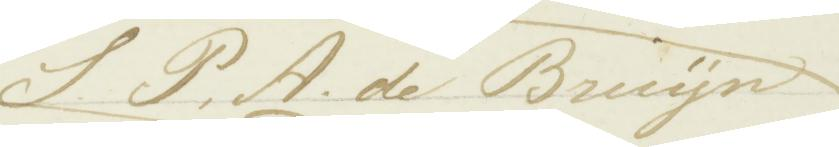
S. P. A. de Bruijn
